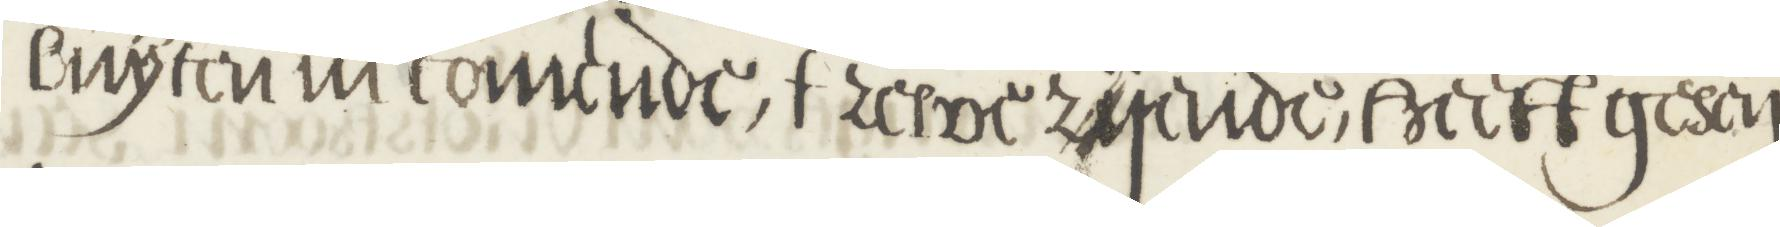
buijten in comende, t zelve zijende, heeft geseij
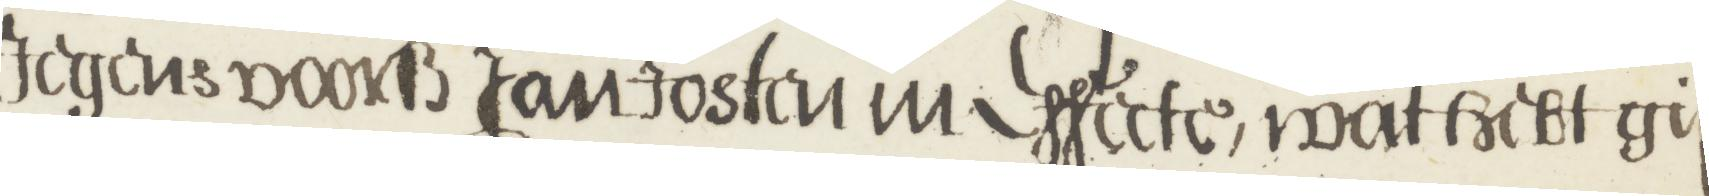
Iegens voorsz Jan Iosten in Effecte, wat hebt gij
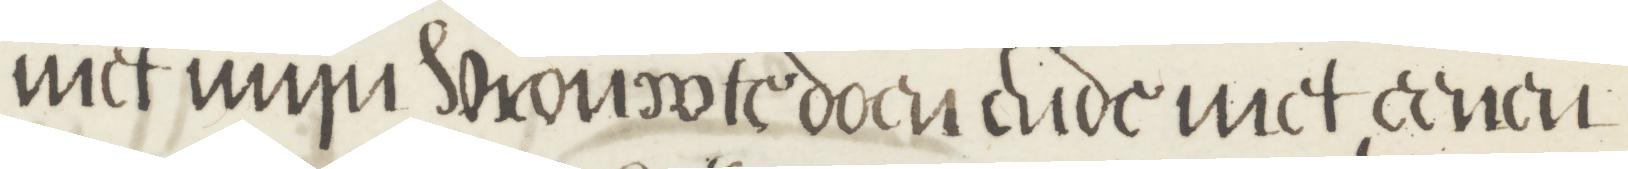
met mijn vrouw te doen ende met eenen
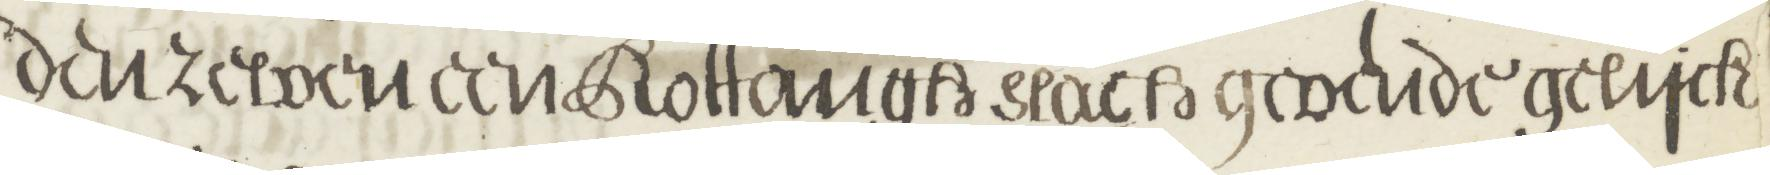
denzelven een Rottangh slach gevende gelijck
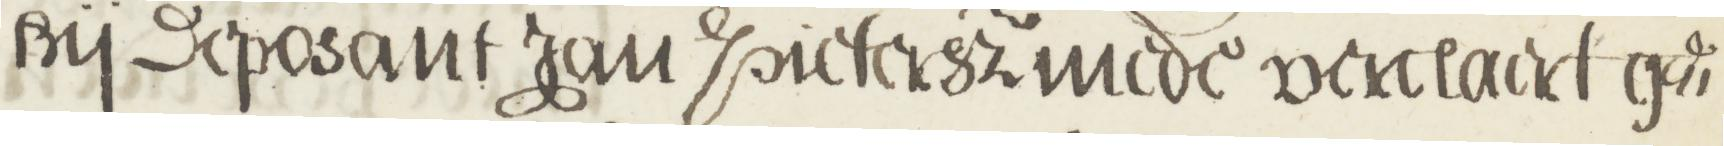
hij deposant Jan Pieterz mede verclaert ge
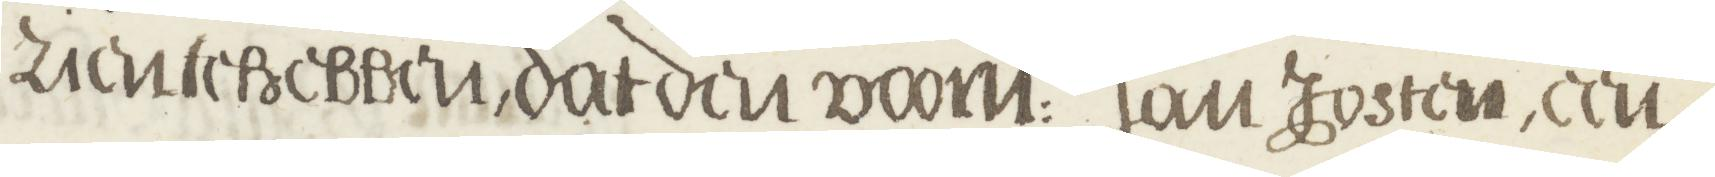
zien te hebben, dat den voorn: Jan Josten, een
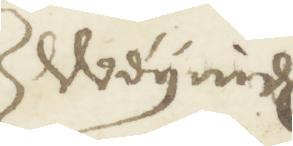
weynich
